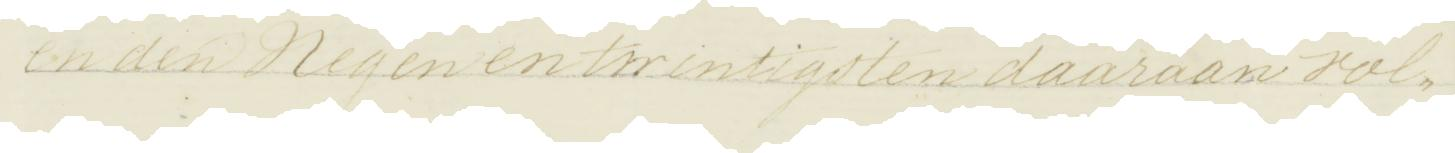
En den Negen en twintigsten daaraan vol„
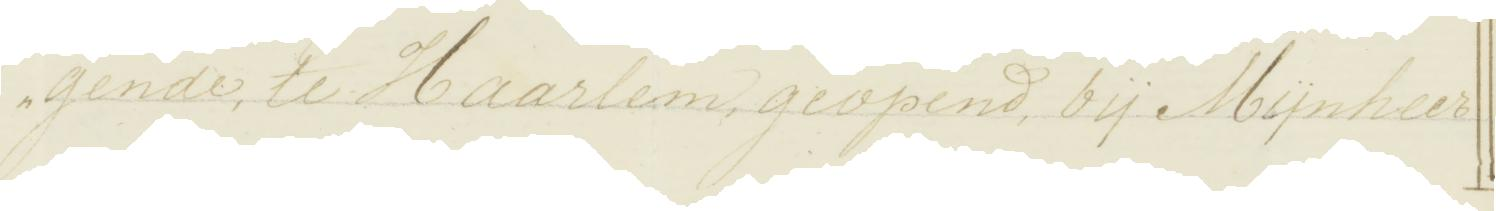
„gende, te Haarlem, geopend, bij Mijnheer
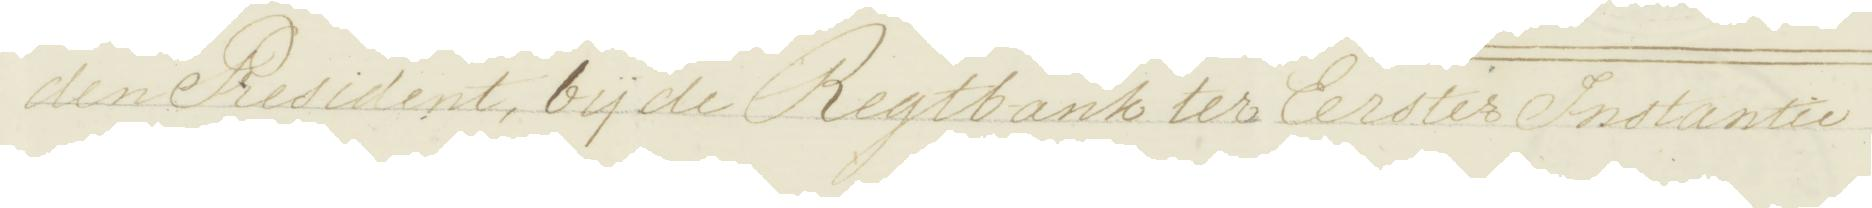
den President, bij de Regtbank ter Eerster Instantie
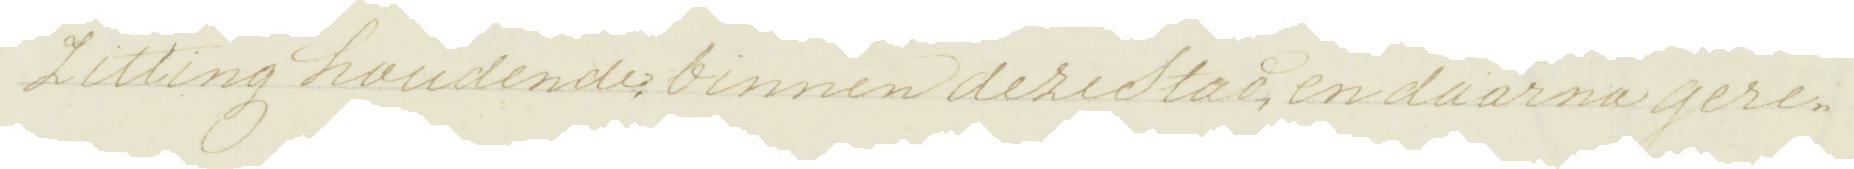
Zitting houdende, binnen deze stad, en daarna gere„
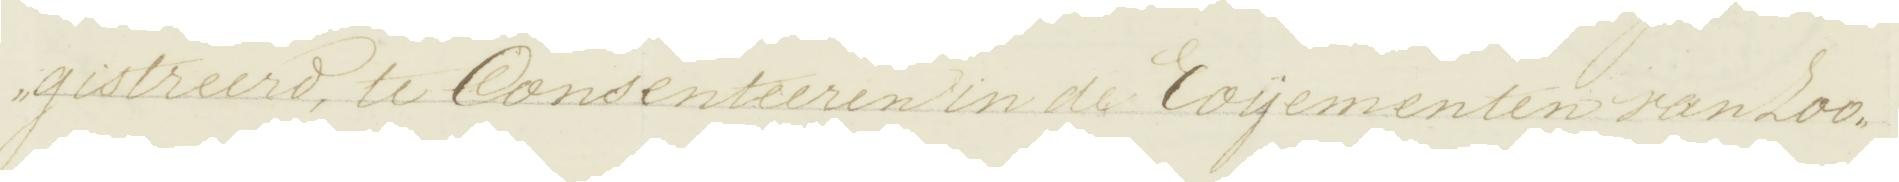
„gistreerd, te Consenteeren in de Roijementen van zoo„
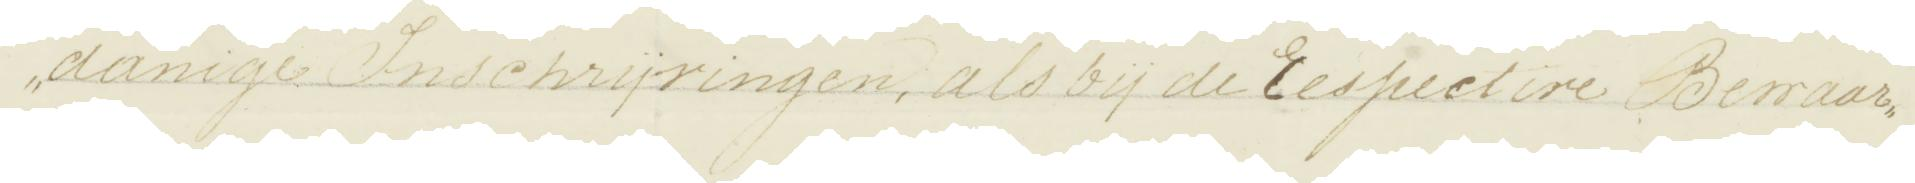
„danige Inschrijvingen, als bij de Respective Bewaar„
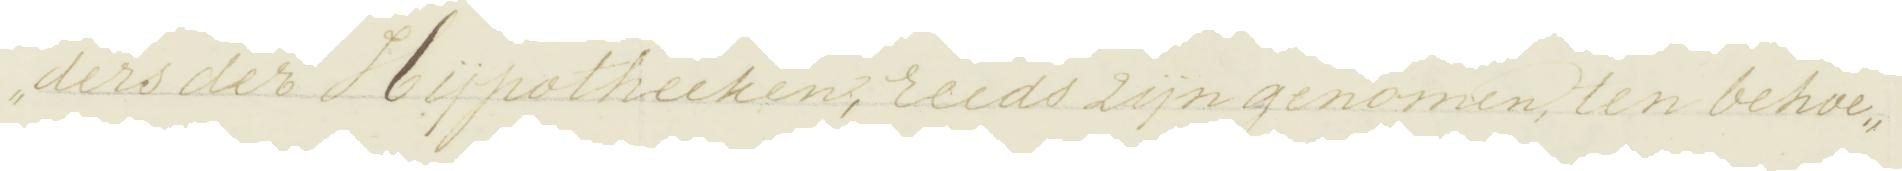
„ders der Hijpotheeken, reeds zijn genomen, ten behoe„
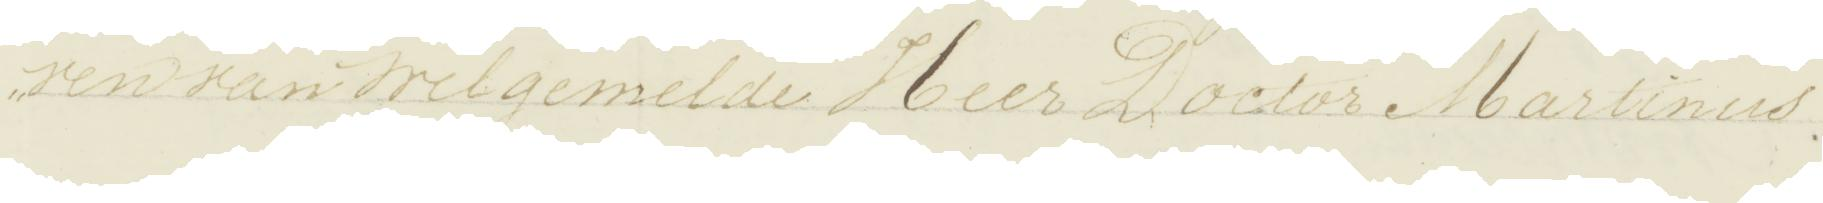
„ven van welgemelde Heer Doctor Martinus
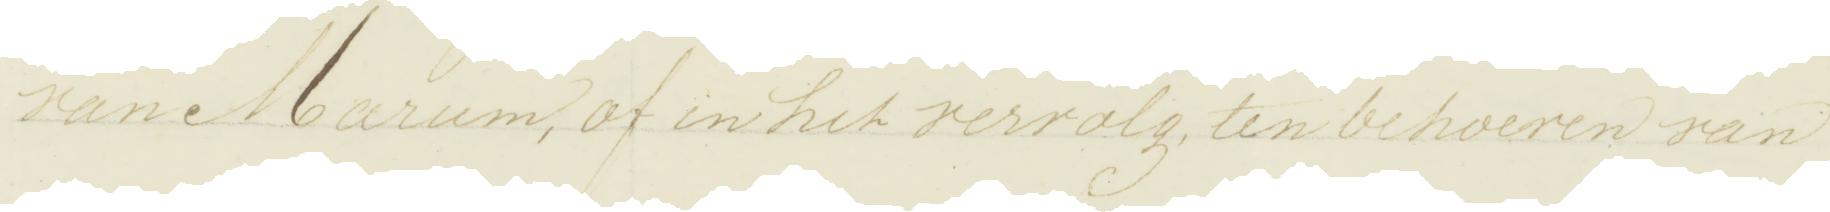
van Marum, of in het vervolg ten behoeven van
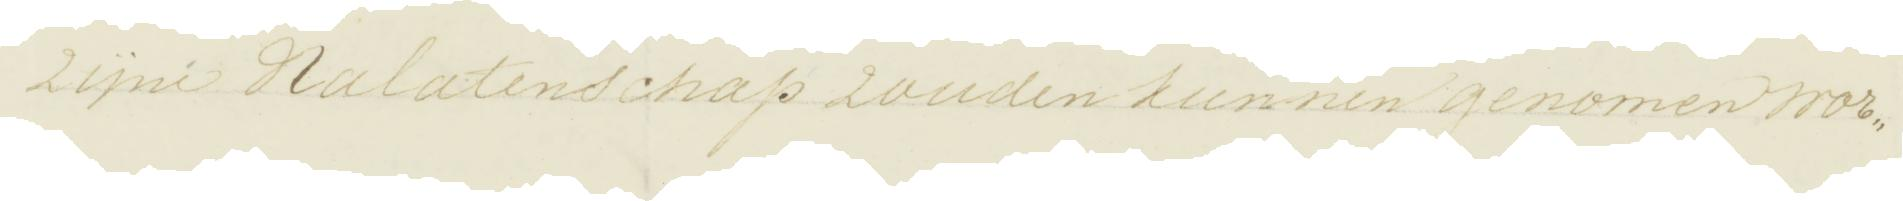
zijne Nalatenschap zouden kunnen genomen wor„
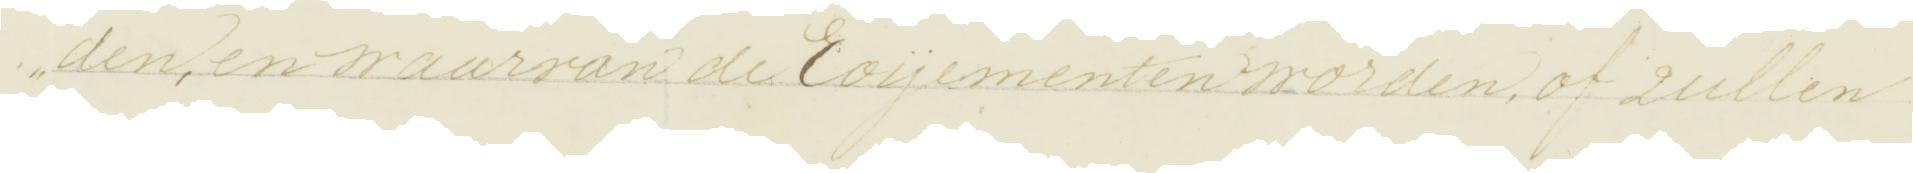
„den, en waarvan de Roijmenten worden, of zullen
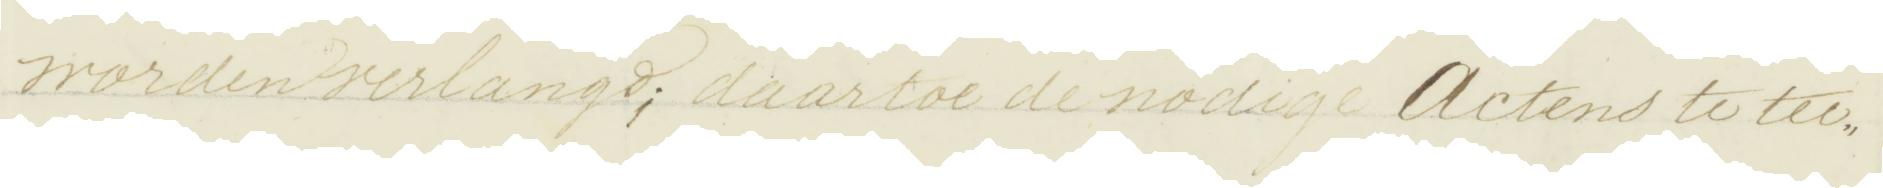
worden verlangd; daartoe de nodige Actens te tee„
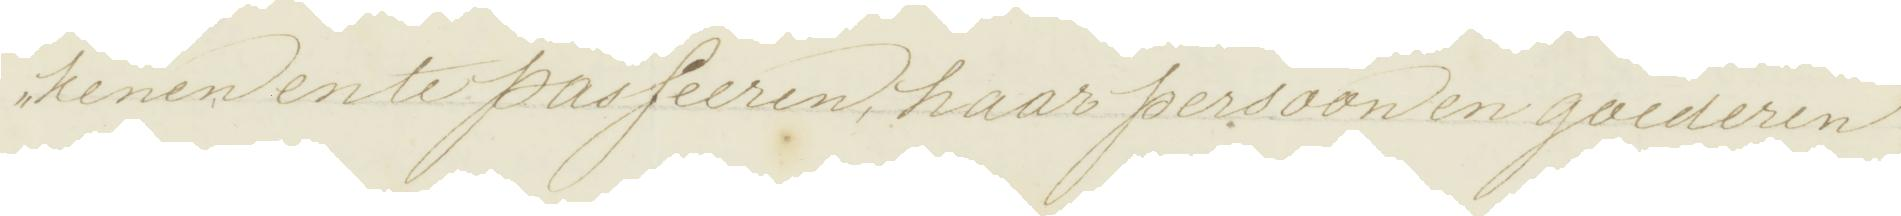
„kenen en te passeeren, haar persoon en goederen
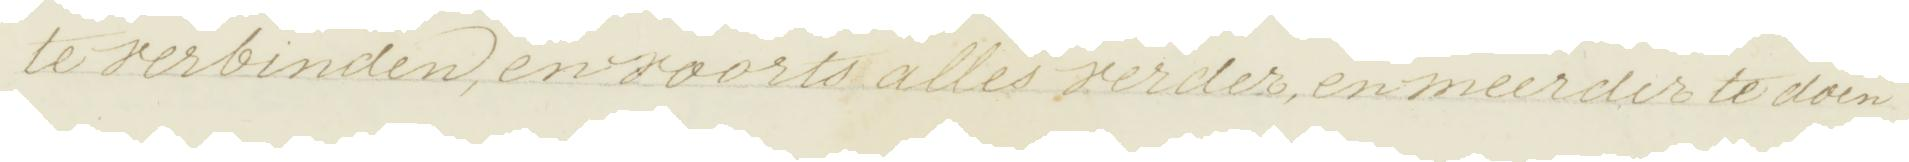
te verbinden, en voorts alles verder, en meerder te doen
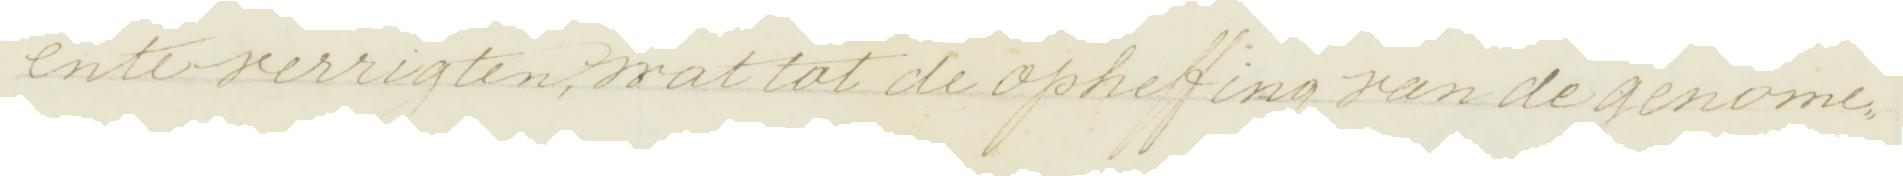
en te verrigten, wat tot de opheffing van de genome„
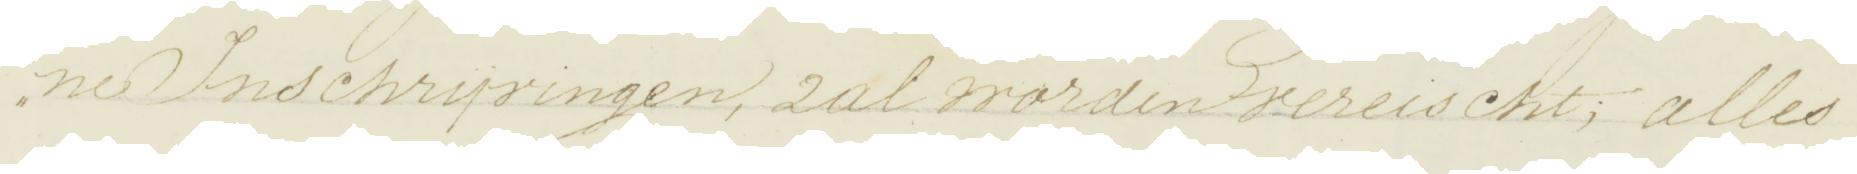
„ne Inschrijvingen, zal worden vereischt; alles
